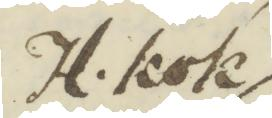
H. Kok
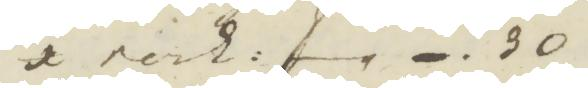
& verh: „ —. 30
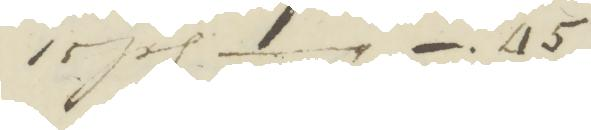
15 pc —„ —. 45
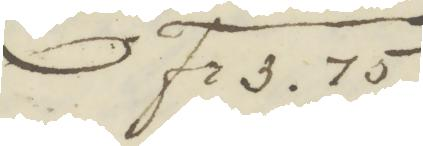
fr. 3.75
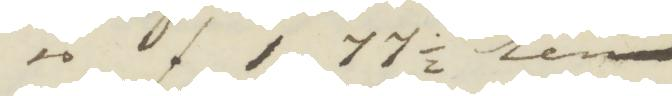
is ƒ 1. 77½ Een
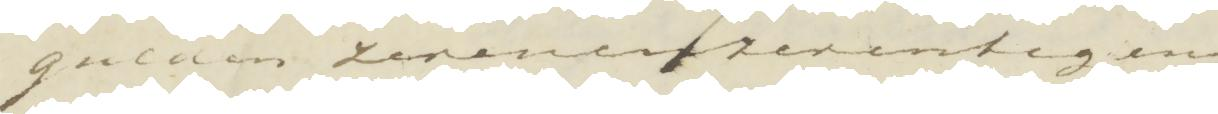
gulden zevenenzeventig en
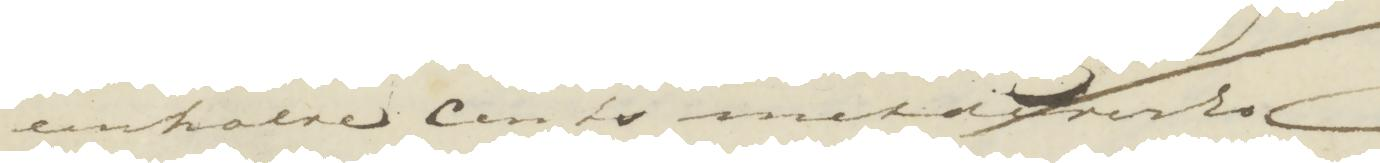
eenhalve Cents metdeverho
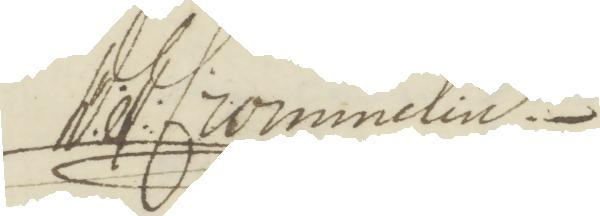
D:F: Crommelin.—
